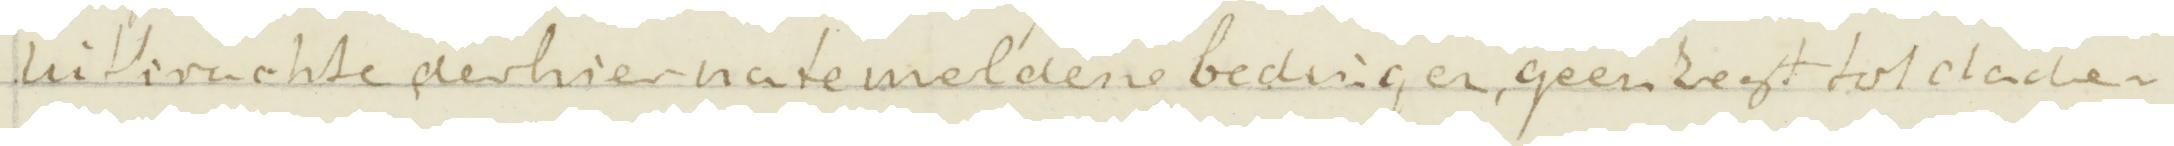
uit krachte der hier na te meldene bedinger, geen regt tot dade=
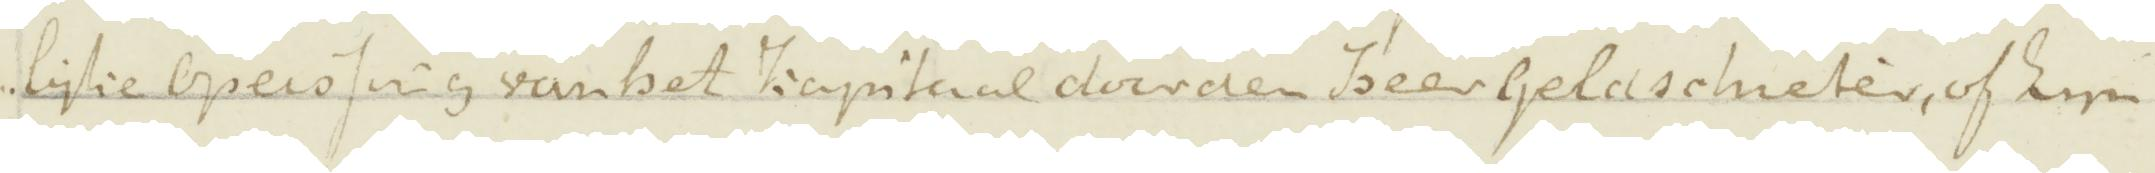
„lijke opeissing van het Kapitaal door den Heer Geldschieter, of zyn
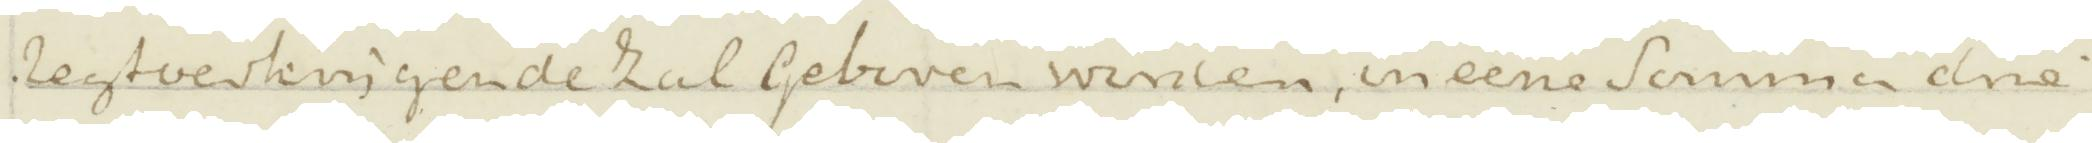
regtverkrijgende zal geboren worden, in eene somma drie
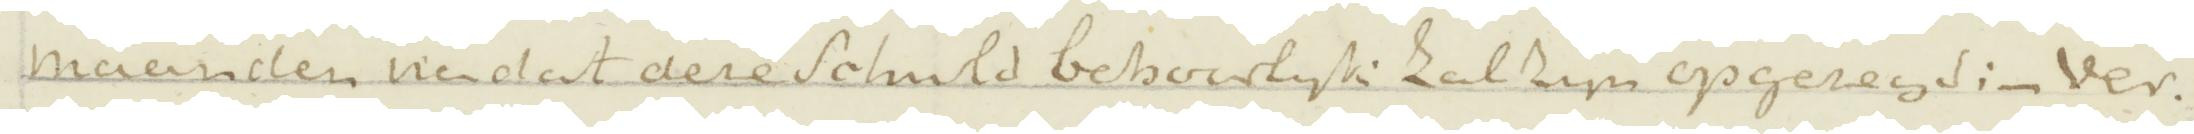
maanden na dat deze schuld behoorlyk zal zyn opgezegd: – ver.
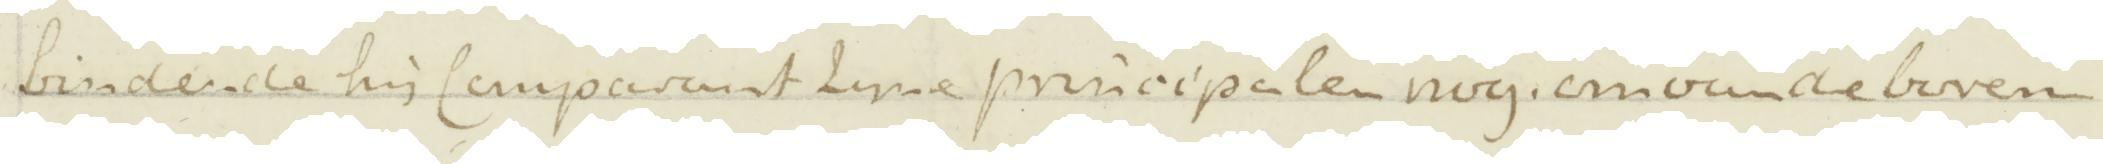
bindende hij Comparant zyne principalen nog, om van de boven
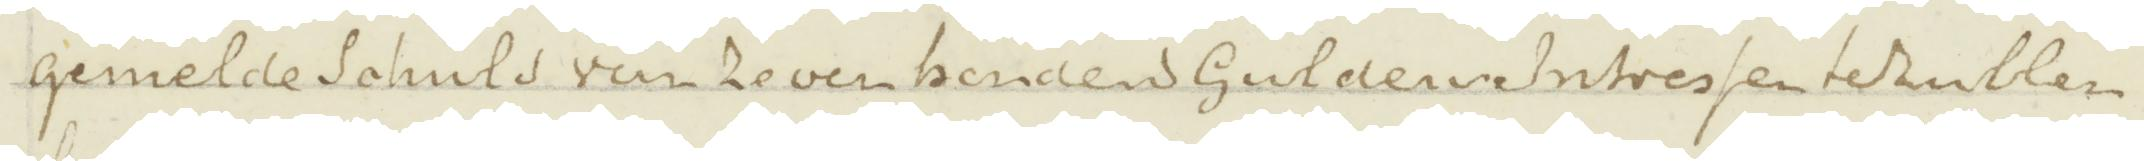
gemelde schuld van zeven honderd Gulden Jntressen te zullen
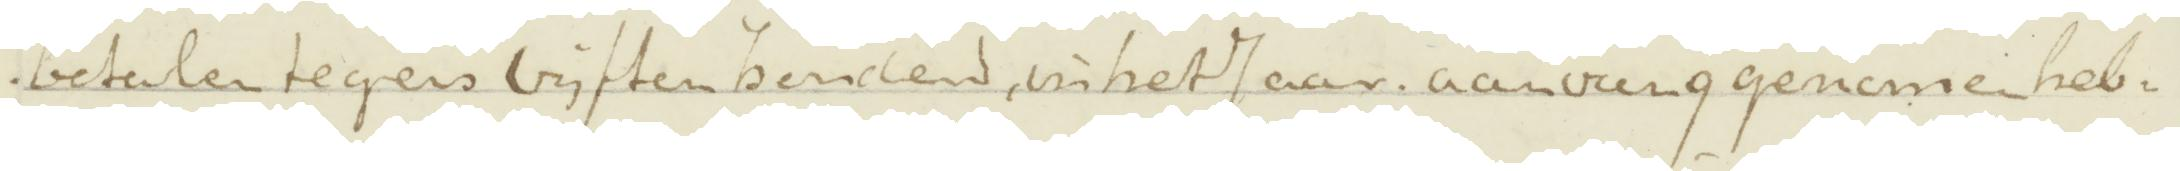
betalen tegen vijftenhonderd, in het Jaar. aanvang genomen heb=
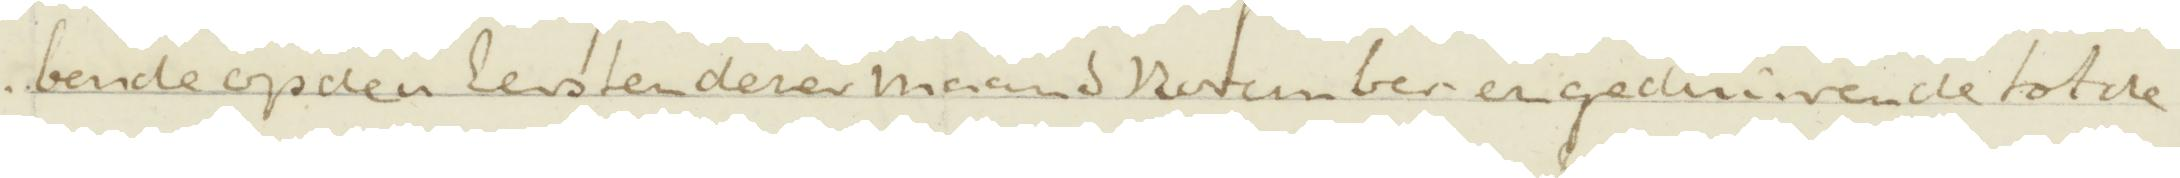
bende op den Eersten dezer Maand November en geduurende tot de
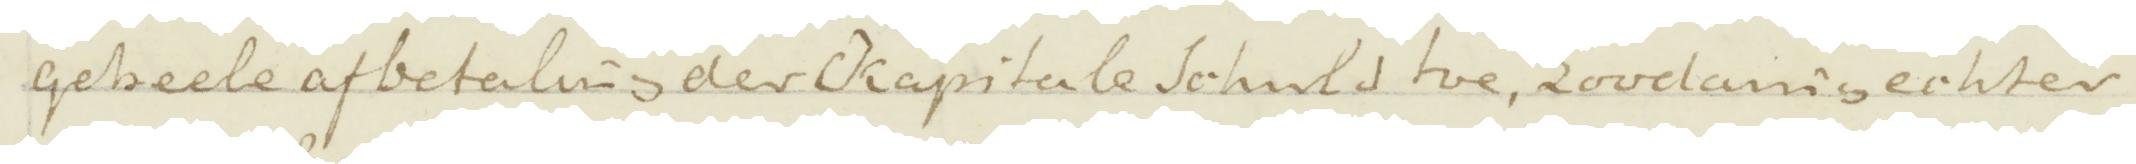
geheele afbetaling der Kapitale schuld toe, zoodanig echter
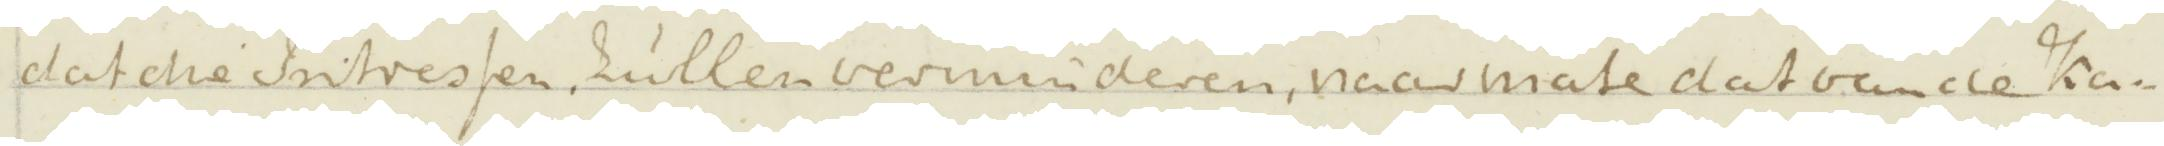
dat die Jntressen, zullen verminderen, naar mate dat van de Ka=
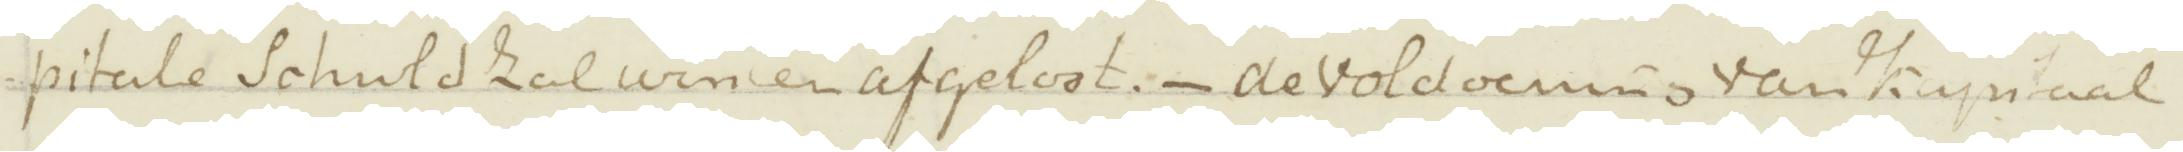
=pitale schuld zal woren afgelost. – de voldoening van Kapitaal
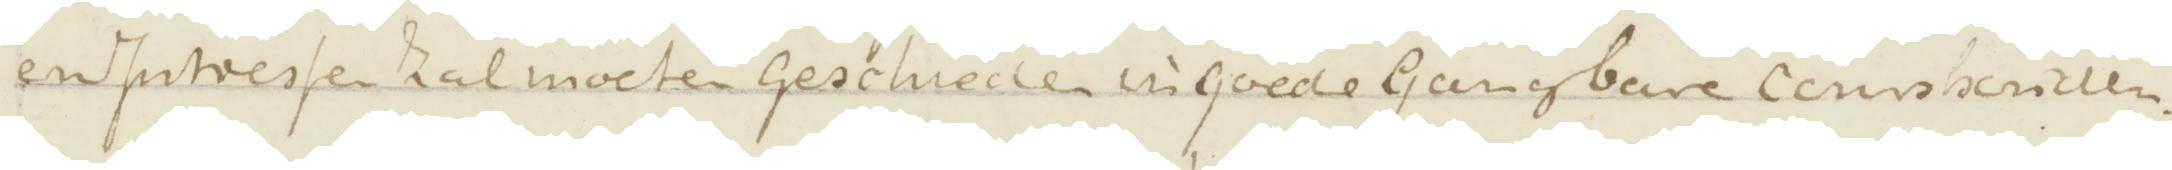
en Jntresse zal moeten geschieden in goede Gangbare courshouden
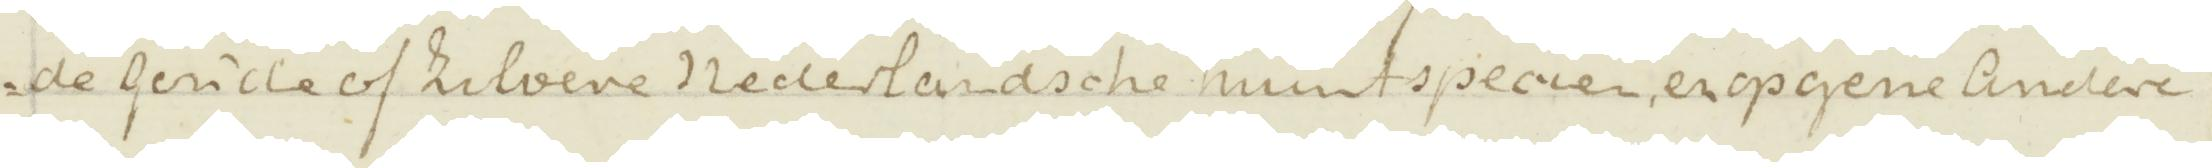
=de goude of zilvere Nederlandsche muntspecien, en op gene andere
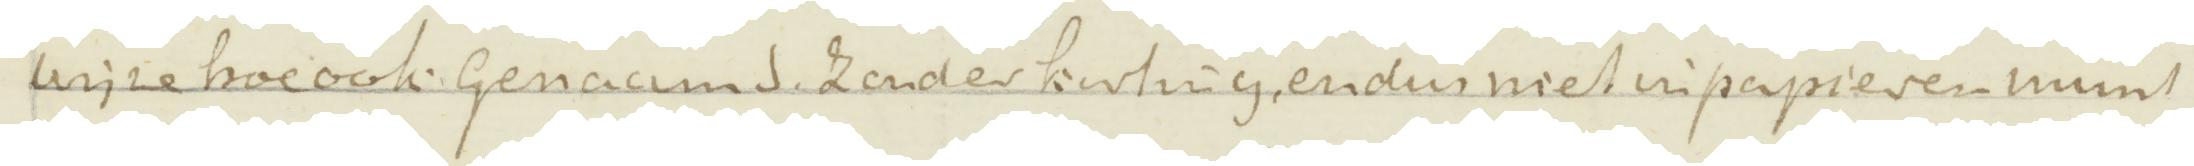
wijze hoe ook Genaamd, zonder korting, en dus niet in papieren munt
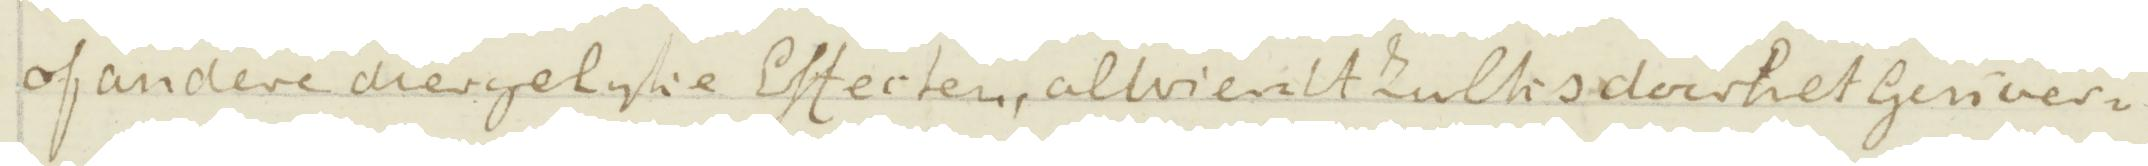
of andere diergelyke Effecten, alwierd zulks door het Gouver=
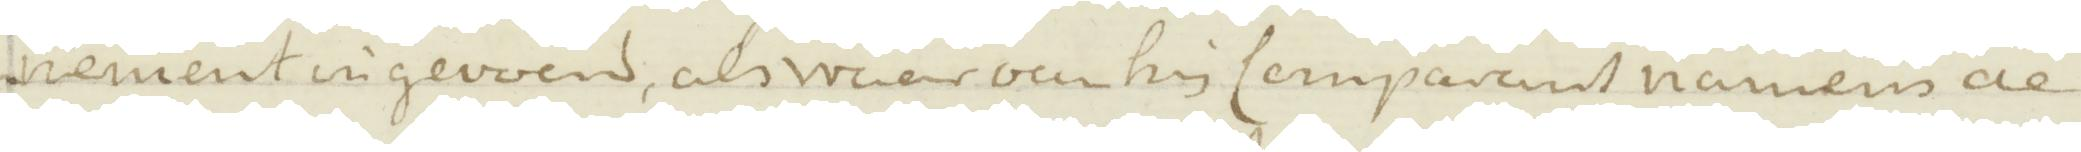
-nement in gevoerd, als waarvan hij Comparant namens de
